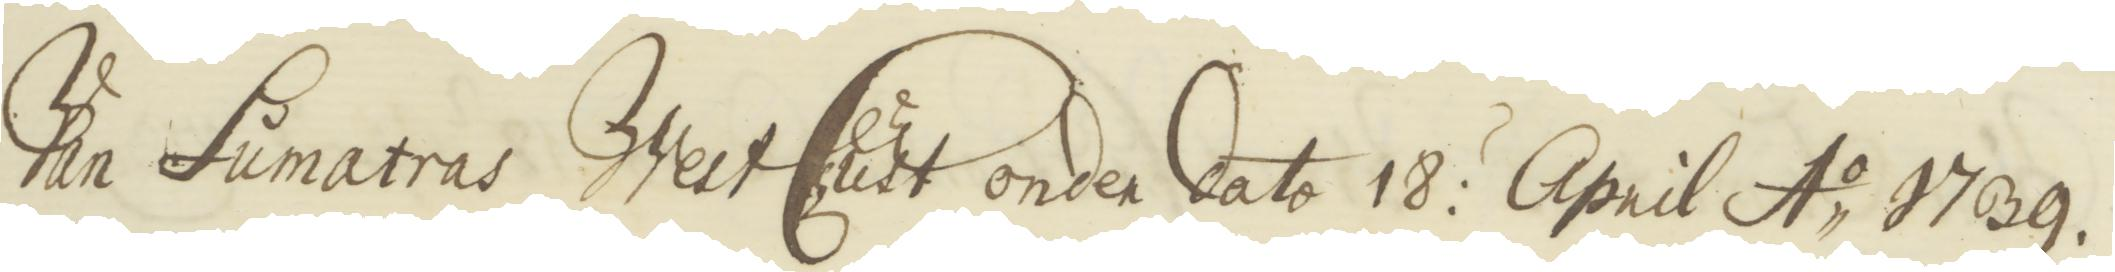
Van Sumatras West Cust onder dato 18:' April A„o 1739.
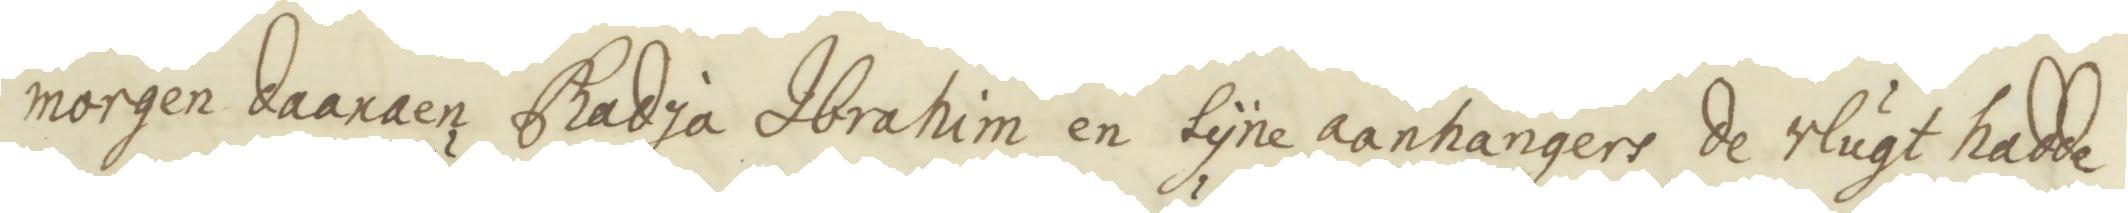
morgen daaraen Radja Abrahim en sijne aanhangers de vlugt hadde
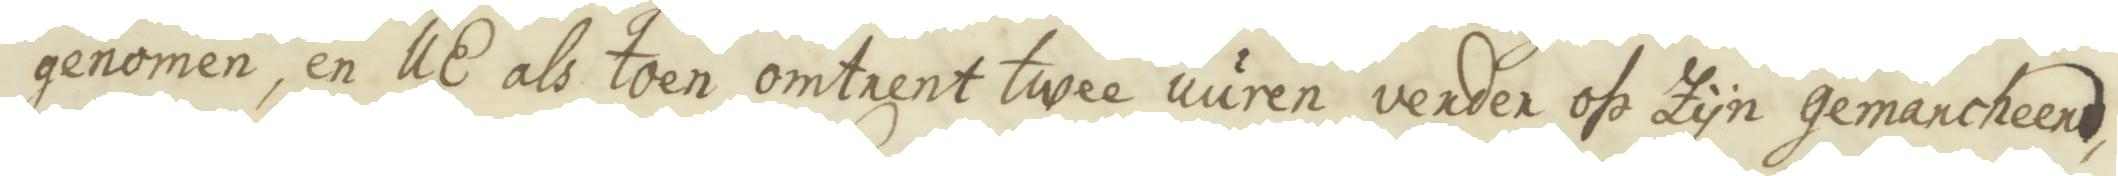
genomen, en UE als toen omtrent twee uuren verder op zijn gemarcheerd,
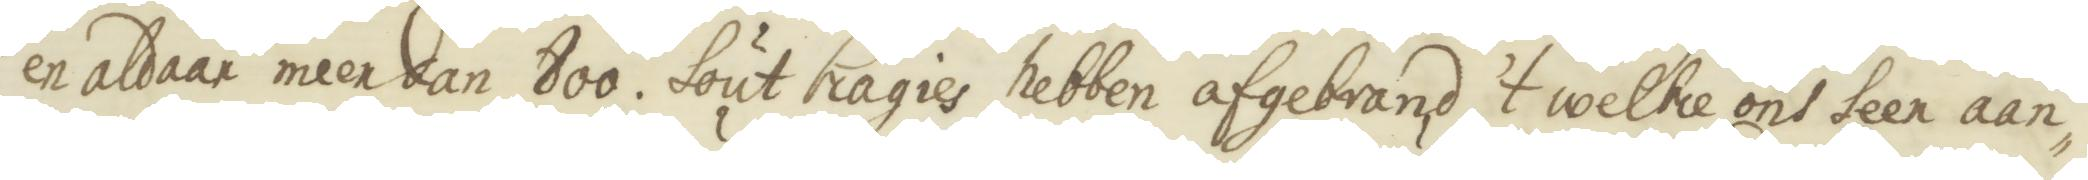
en aldaar meer dan 800. sout kagies hebben afgebrand, ’t welke ons seer aan„
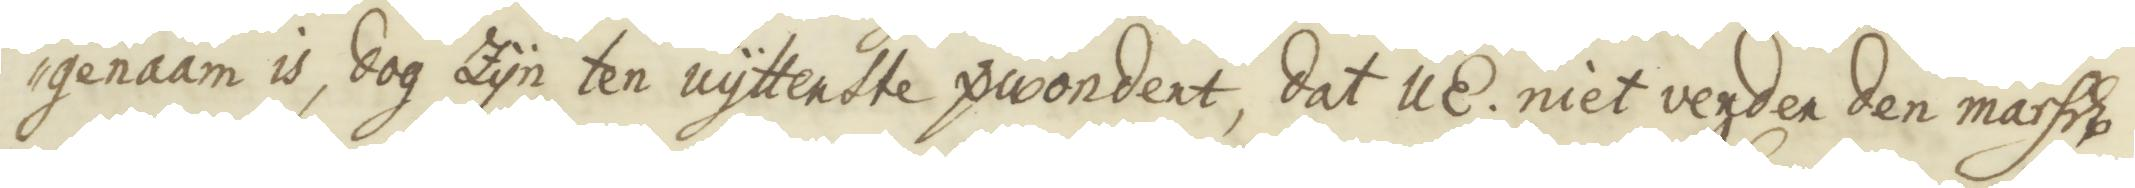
„genaam is, dog zijn ten uijtterste verwondert, dat UE. niet verder den marsch
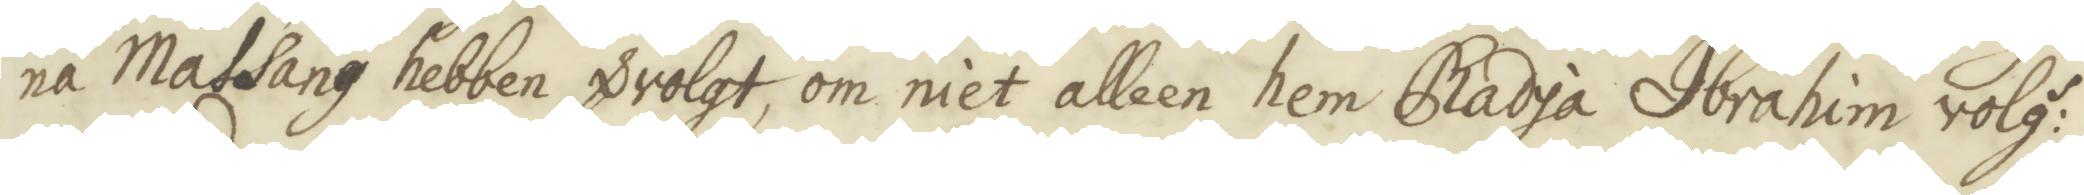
na Massang hebben vervolgt, om niet alleen hem Radja Abrahim volg:s
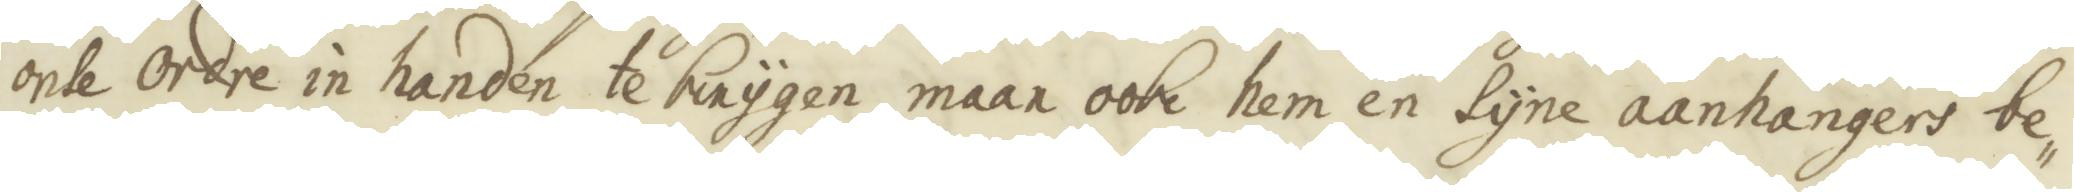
onse ordre in handen te krijgen, maar ook hem en sijne aanhangers be„
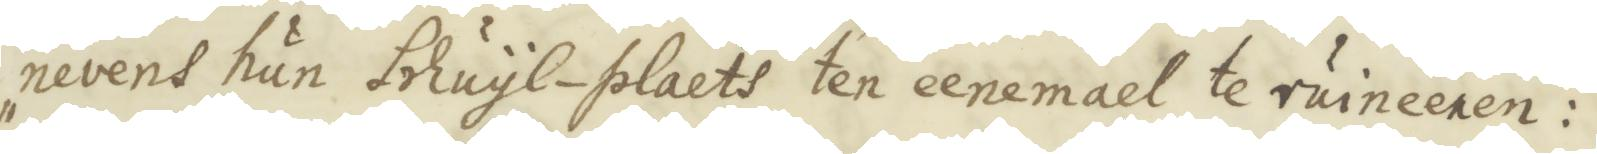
„nevens hun schuijl-plaets ten eenemael te ruineeren:
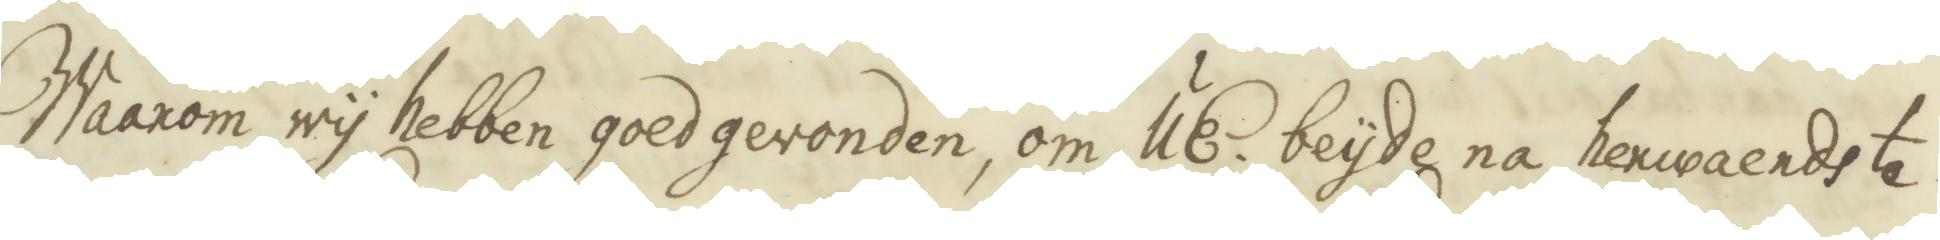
Waarom wij hebben goed gevonden, om UE. beijde na herwaerds te
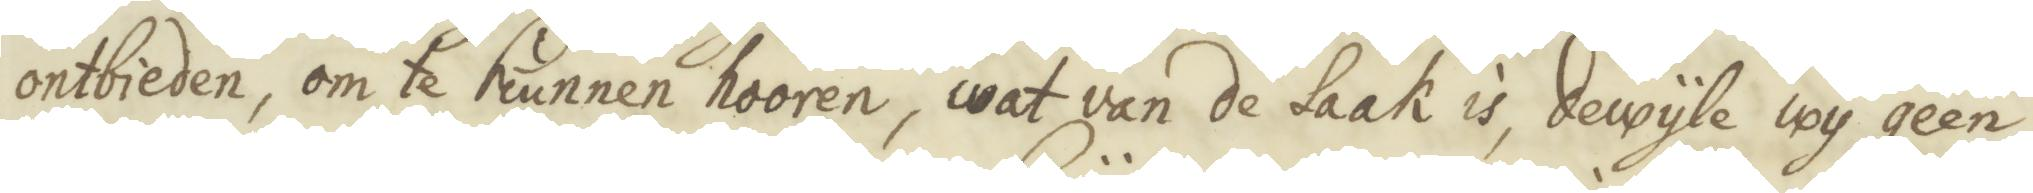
ontbieden, om te kunnen hooren, wat van de saak is, dewijle wij geen
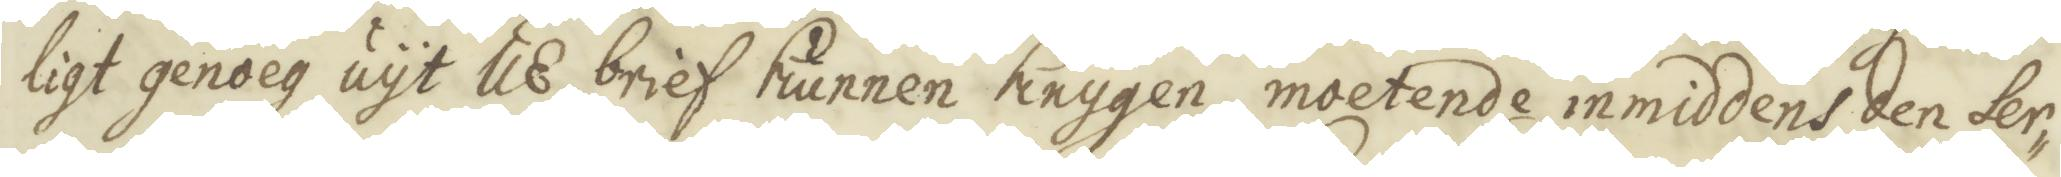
ligt genoeg uijt UE. brief kunnen krijgen, moetende inmiddens den ser„
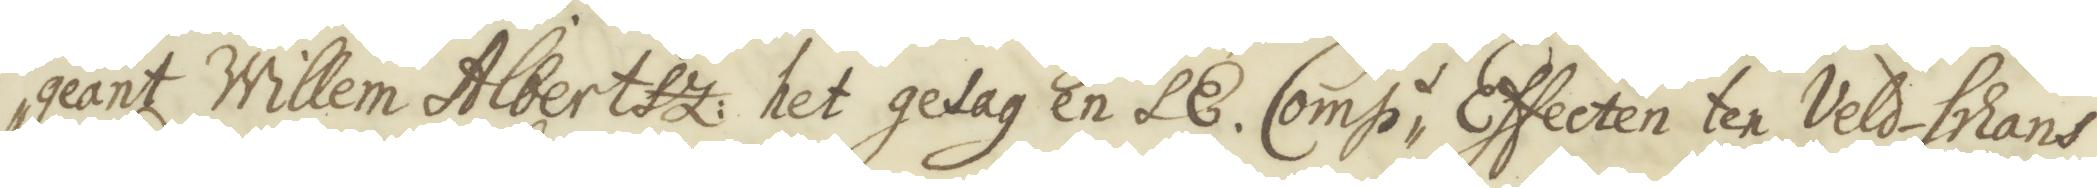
„geant Willem Albertsz: het gesag en 'sE. Comp„s Effecten ter veld-schans
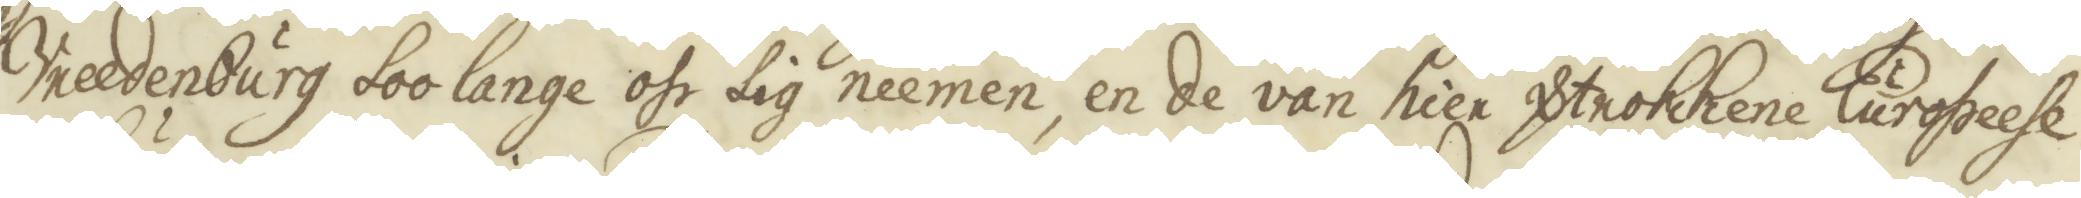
Vreedenburg soo lange op sig neemen, en de van hier vertrokkene Europeese
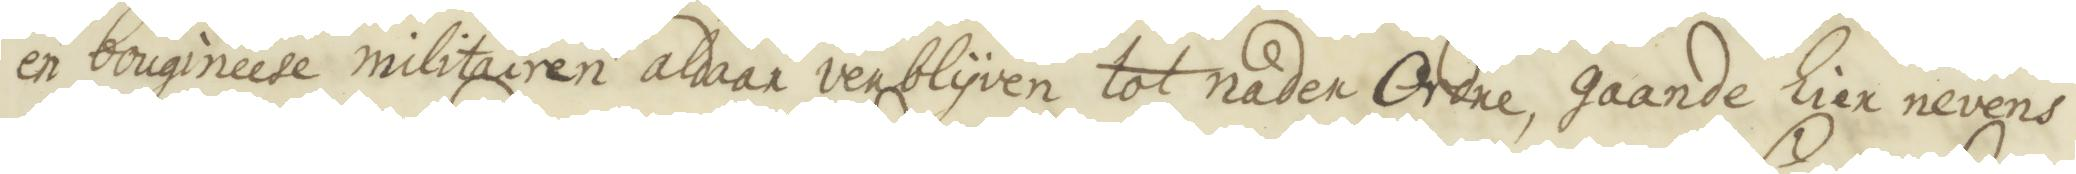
en bougineese militairen aldaar verblijven tot nader Ordre, gaande hier nevens
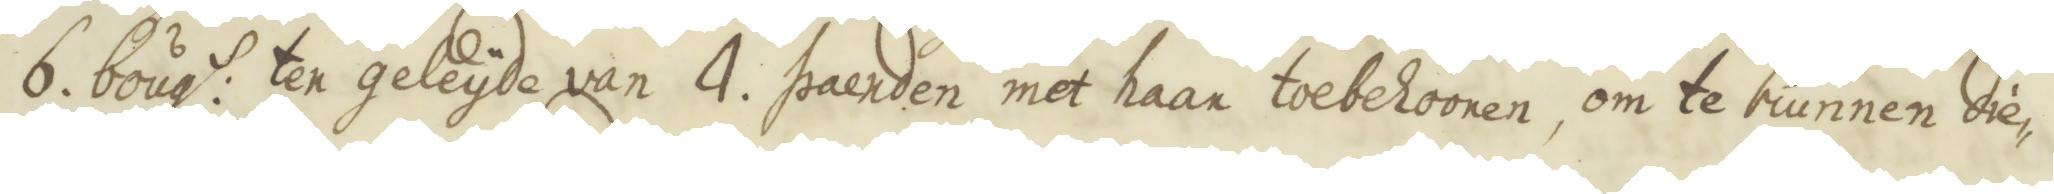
6. boug:s ter geleijde van 4. paerden met haar toebehooren, om te kunnen die„
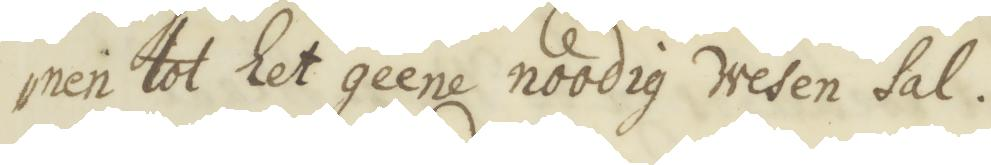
nen tot het geene noodig wesen sal.
